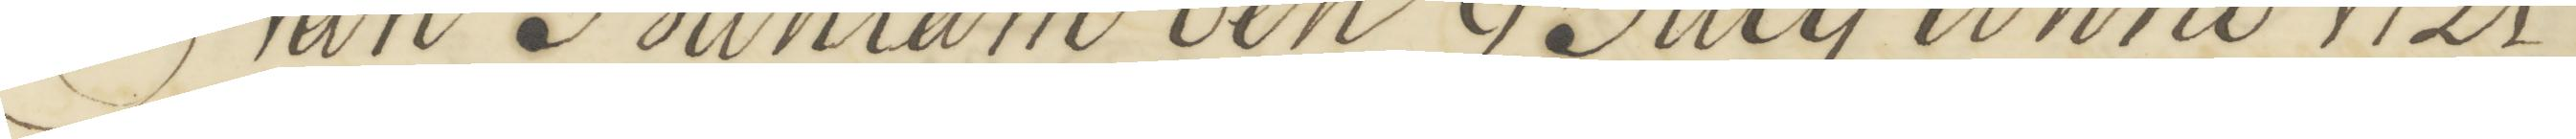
Van Bantam den 9 Julij Anno 1721
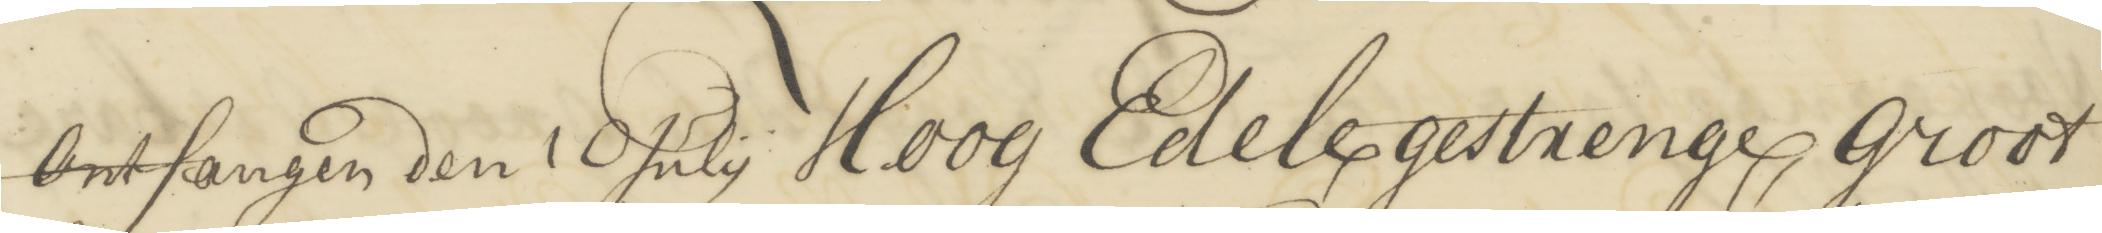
Ontfangen den 10 Julij Hoog Edele gestrenge, groot
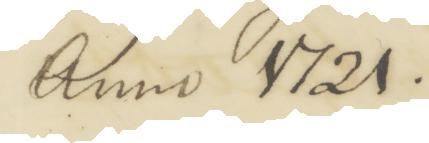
Anno 1721
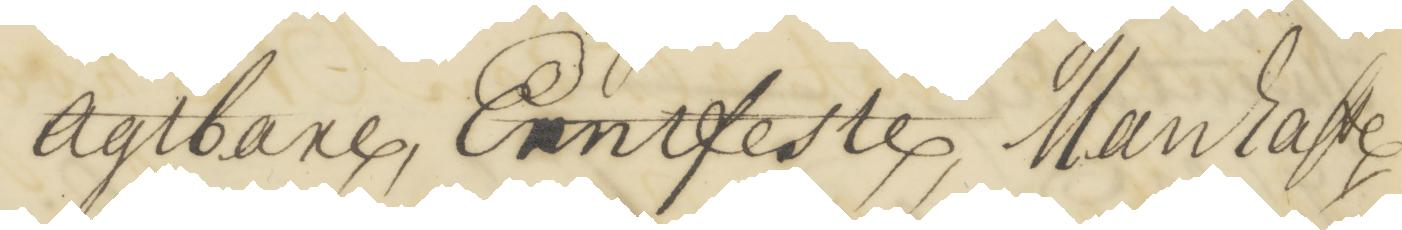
agtbare, Erntfeste, Manhafte,
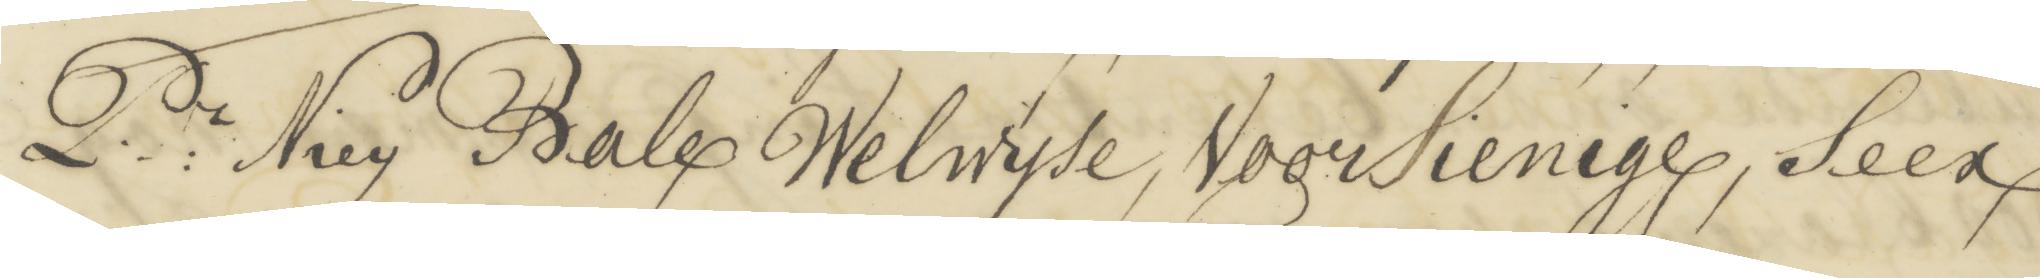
P:r Niey Bale Welwijse, Voorsienige, Seer
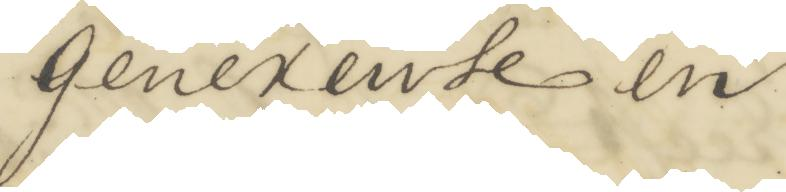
genereuse en
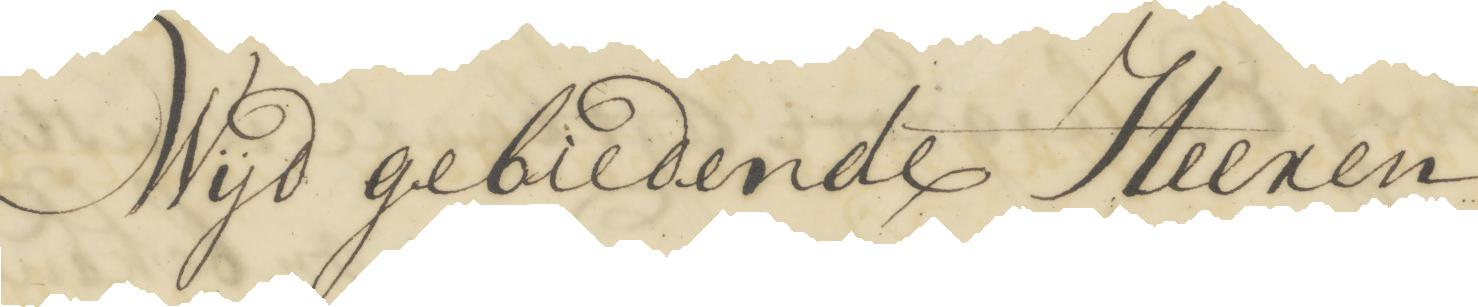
Wijd gebiedende Heeren
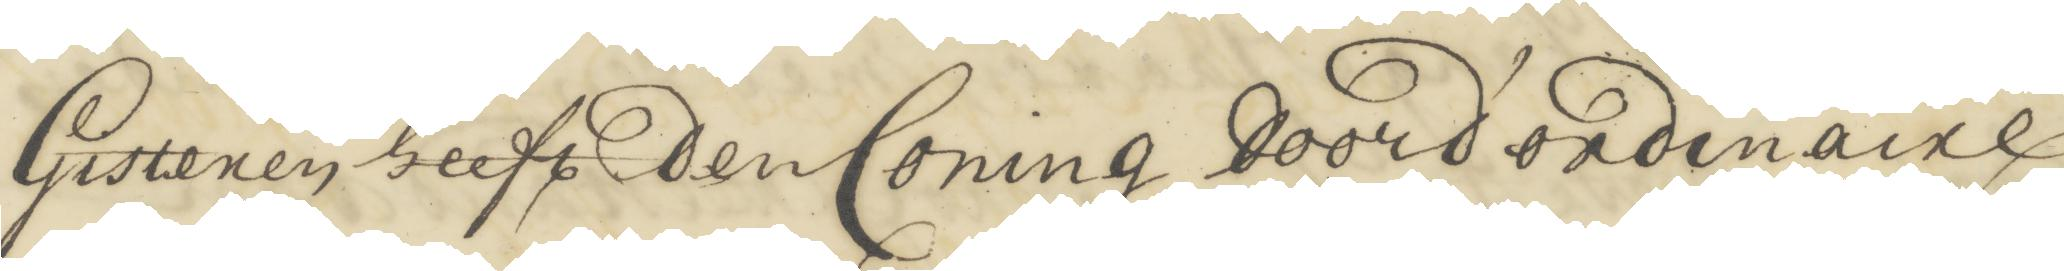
Gisteren heeft den Coning door d’ordinaire
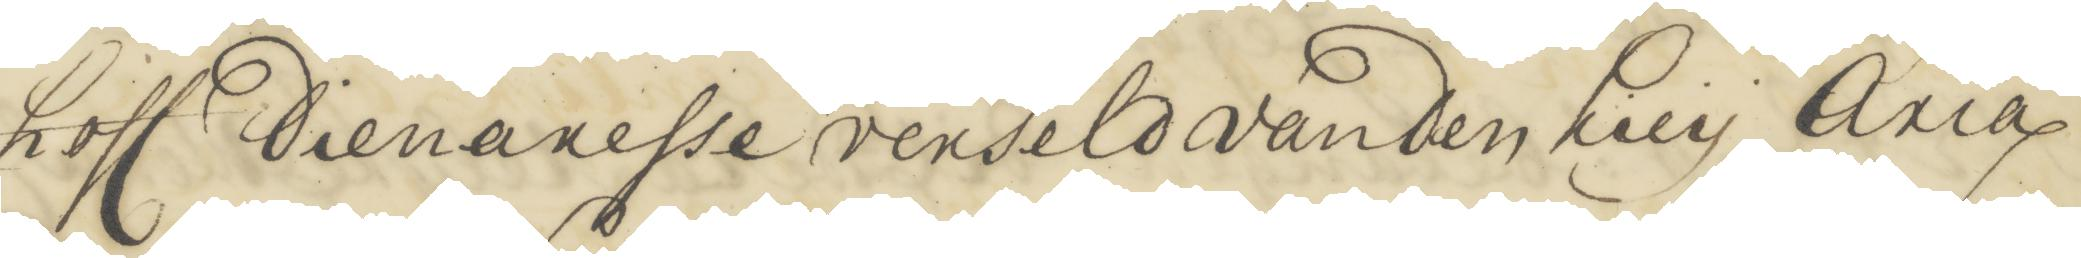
hoff dienaresse verseld van den kieij Aria
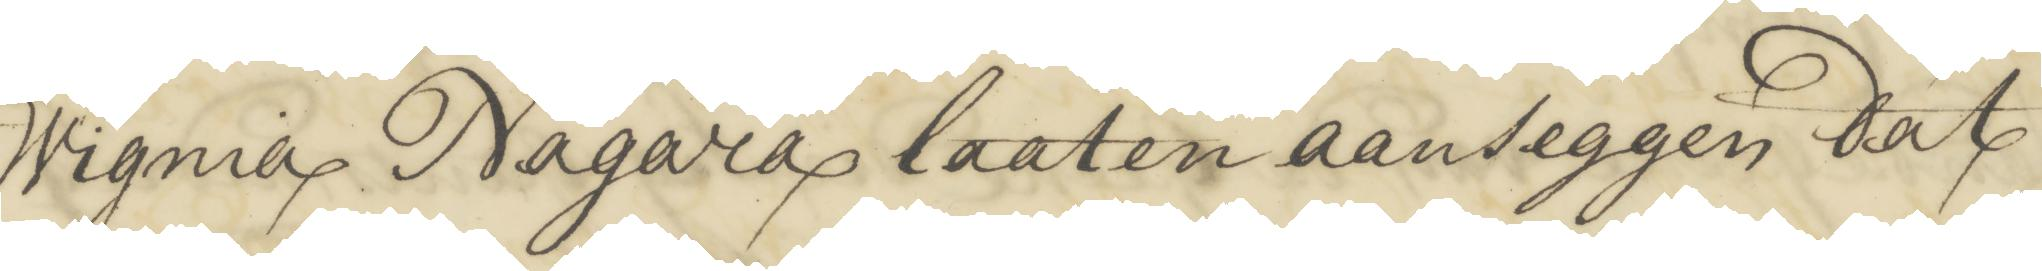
Wignia Nagara laaten aanseggen dat
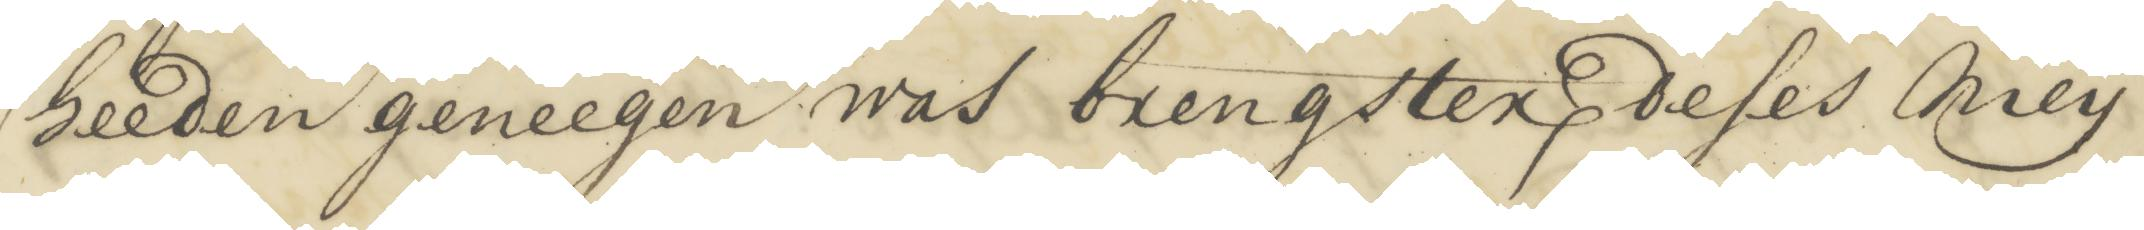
heeden geneegen was brengster deses nieij
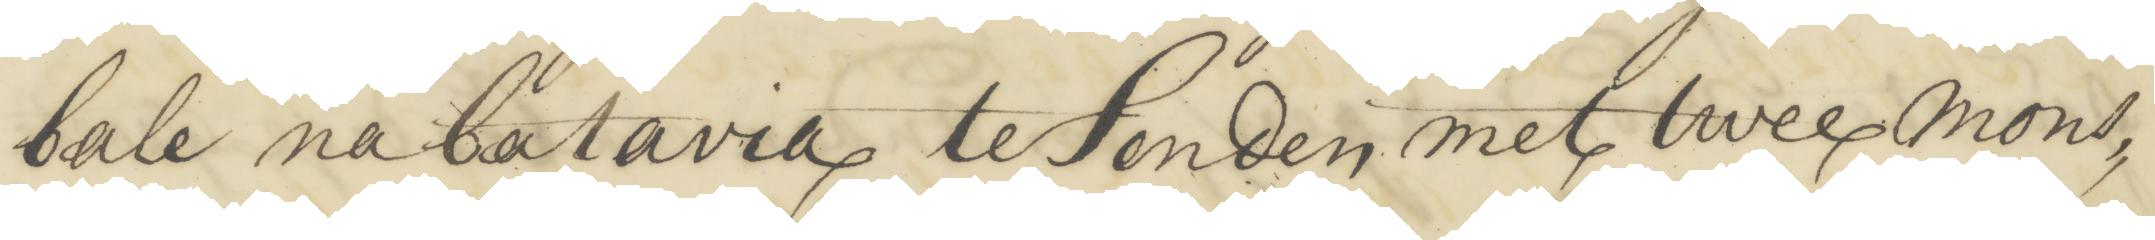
bale na batavia te senden met twee mons„
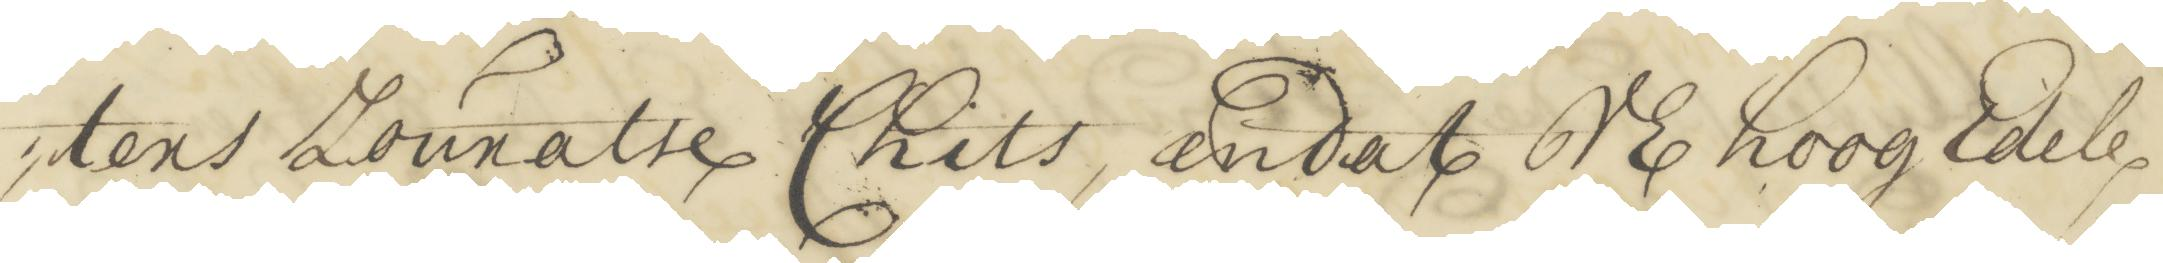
ters zouratse Chits, en dat UE hoog Edele
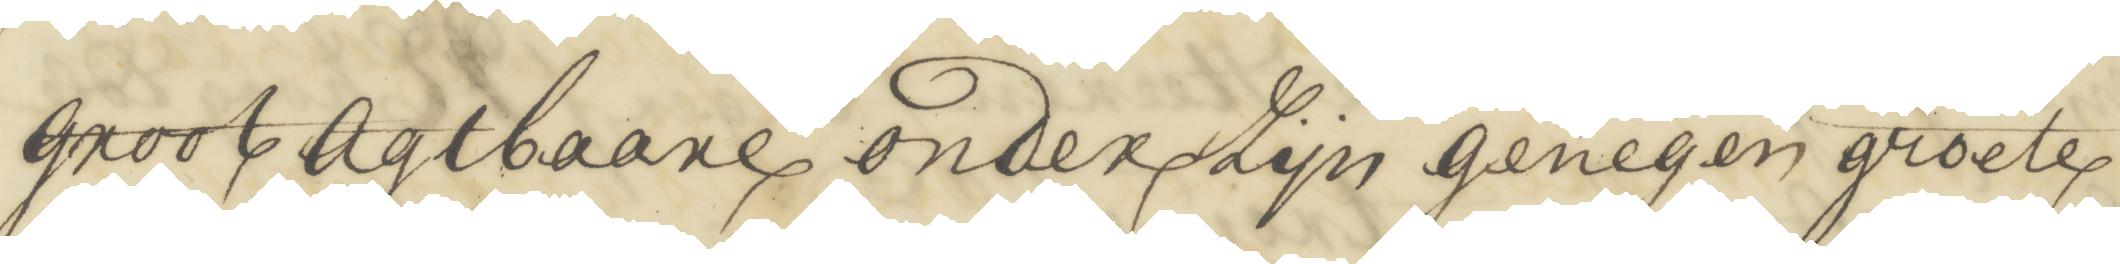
groot agtbaare onder Zijn genegen groete
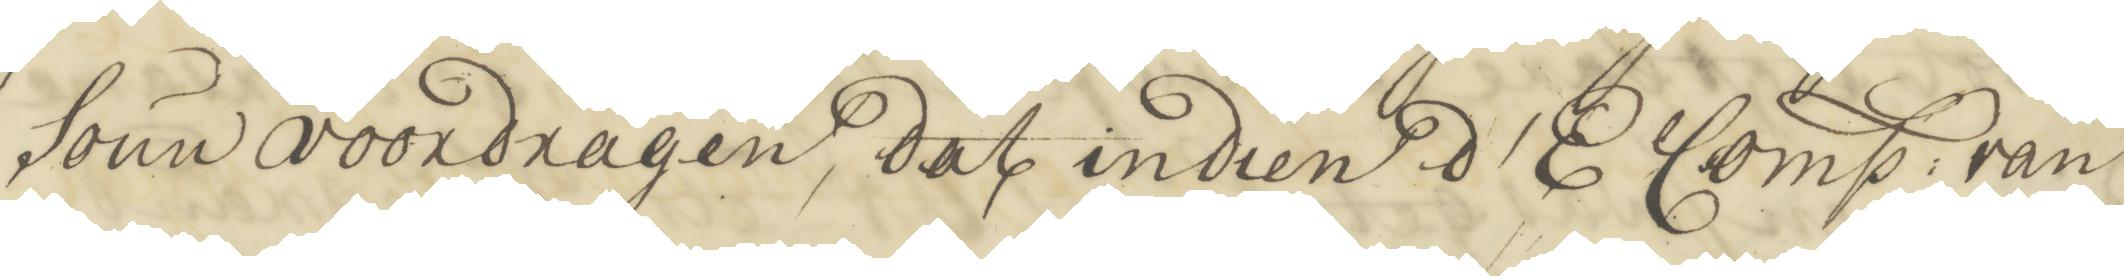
souw voordragen, dat in dien d’E Comp: van
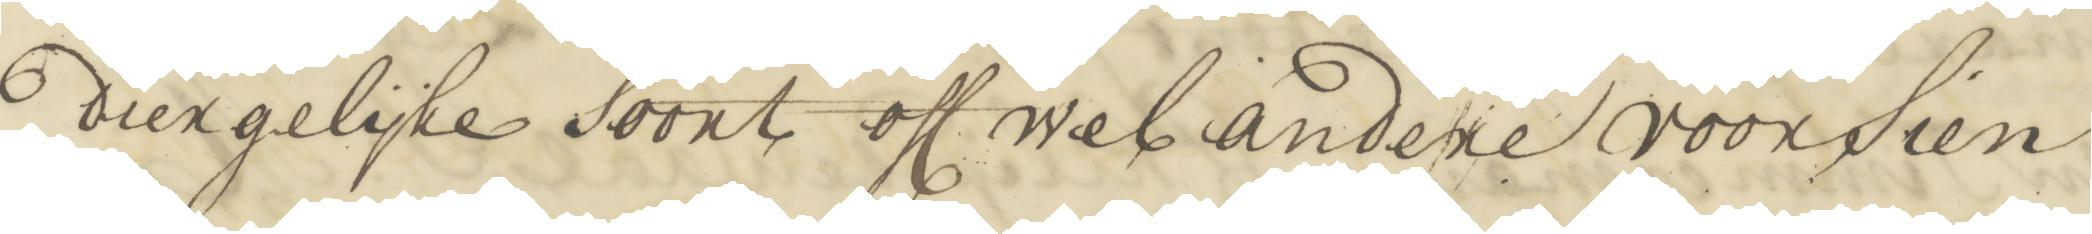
diergelijke soort off wel andere voorsien
